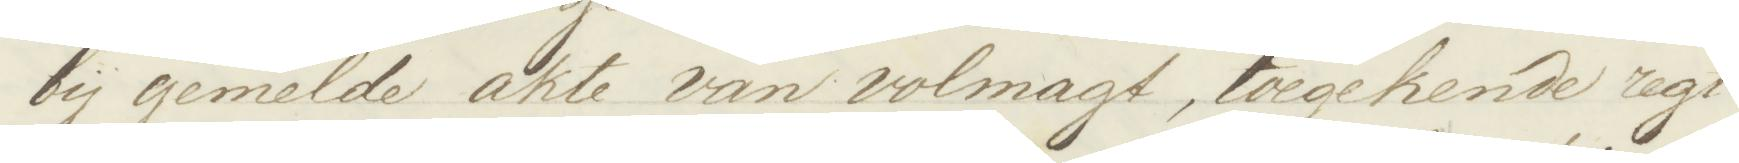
bij gemelde akte van volmagt, toegekende regt
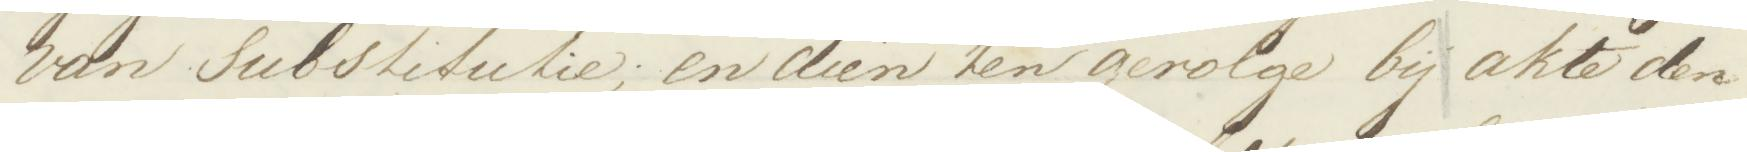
van substitutie; en dien ten gevolge bij akte den
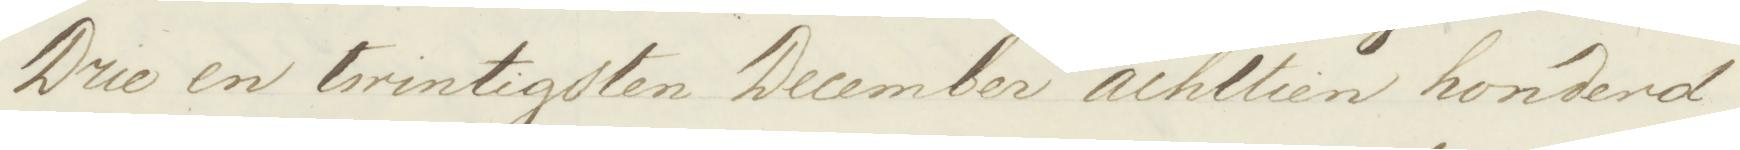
Drie en twintigsten December achttien honderd
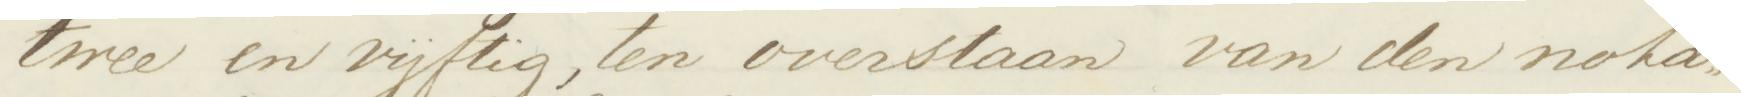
twee en vijftig, ten overstaan van den nota„
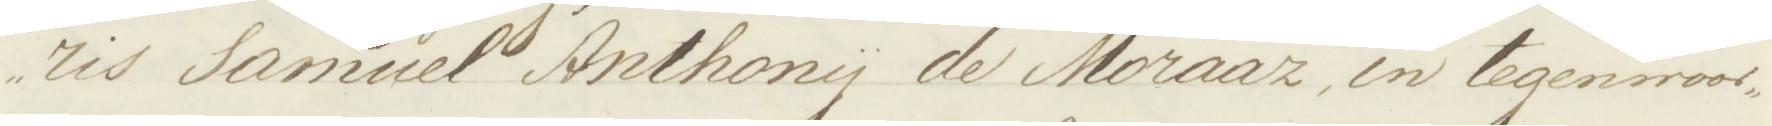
„ris Samuel Anthonij de Moraaz, in tegenwoor„
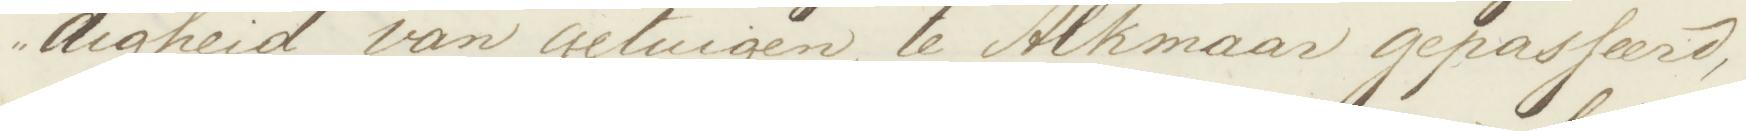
„digheid van getuigen, te Alkmaar gepasseerd,
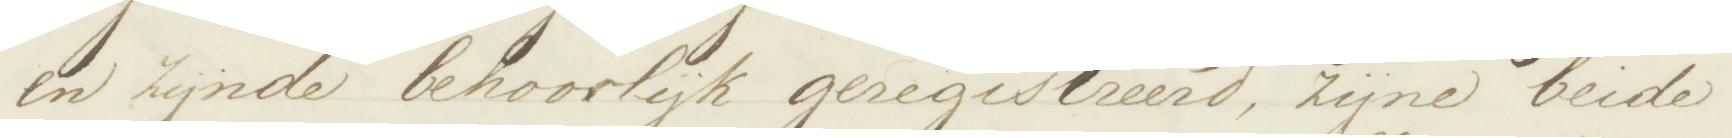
en zijnde behoorlijk geregistreerd, zijne beide
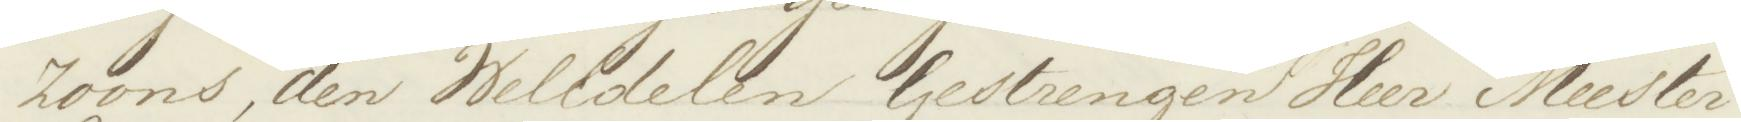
zoons, den WelEdelen Gestrengen Heer Meester
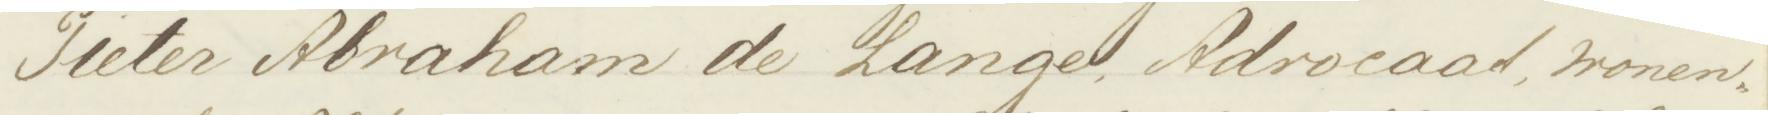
Pieter Abraham de Lange, Advocaat, wonen„
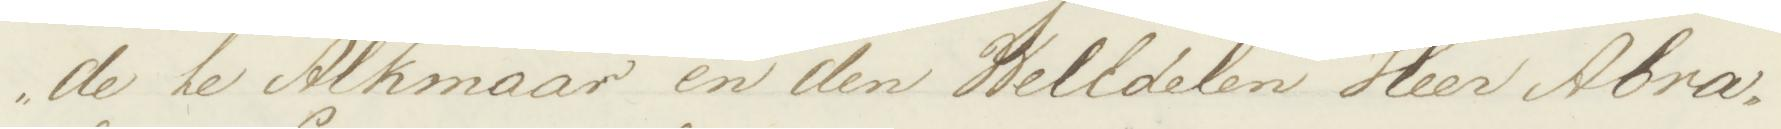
„de te Alkmaar en den WelEdelen Heer Abra„
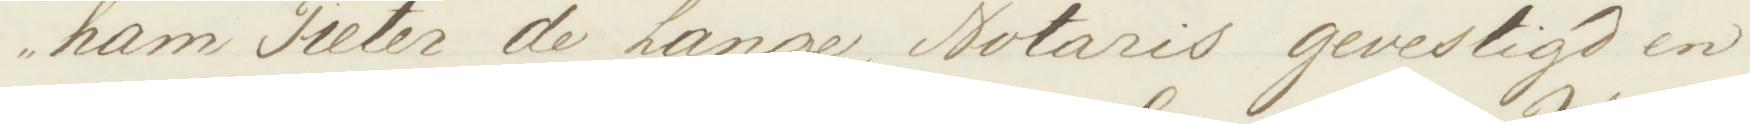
„ham Pieter de Lange, Notaris gevestigd en
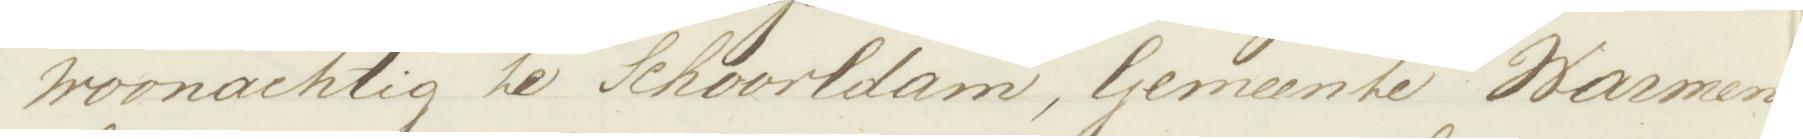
woonachtig te Schoorldam, Gemeente Warmen
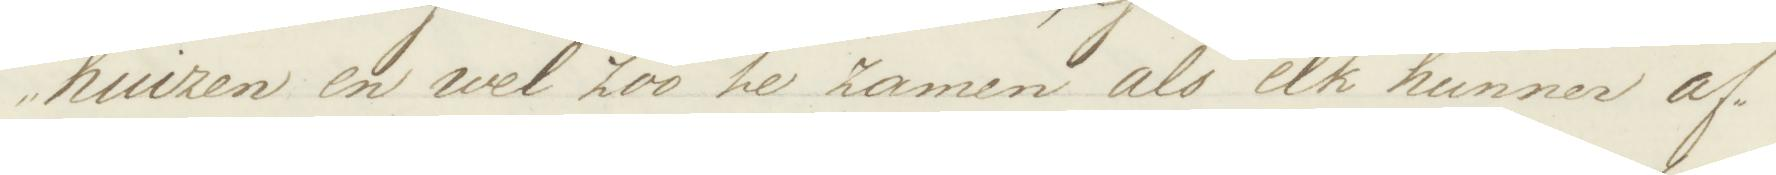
„huizen en wel zoo te zamen als elk hunner af„
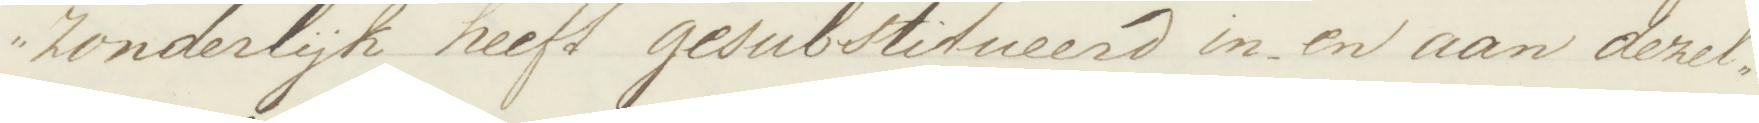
„zonderlijk heeft gesubstitueerd in- en aan dezel„
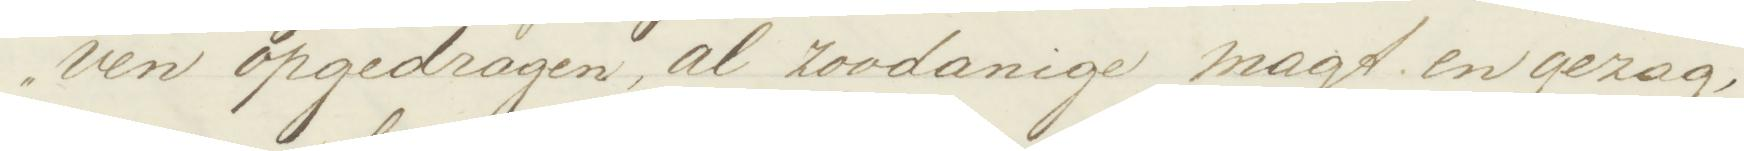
„ven opgedragen, al zoodanige magt en gezag,
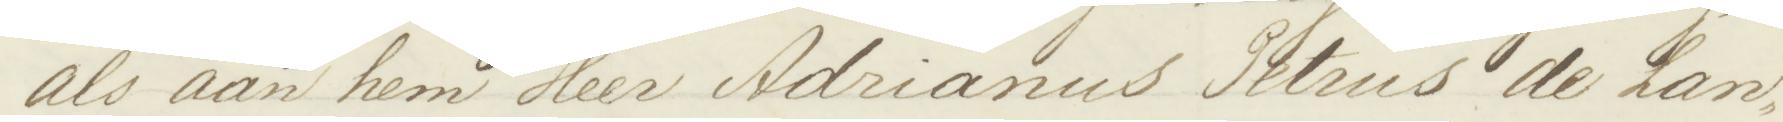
als aan hem Heer Adrianus Petrus de Lan„
